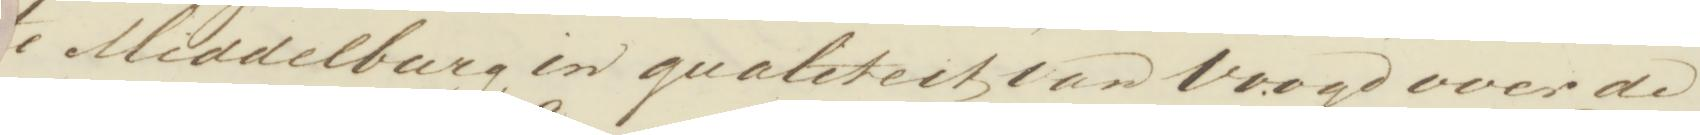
te Middelburg, in qualiteit van voogd over de
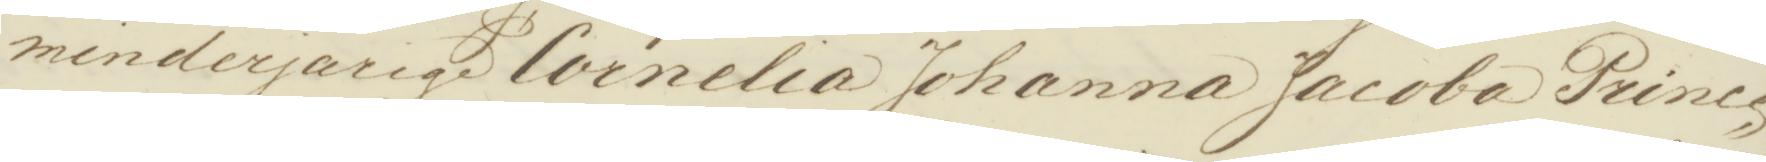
minderjarige Cornelia Johanna Jacoba Prince,
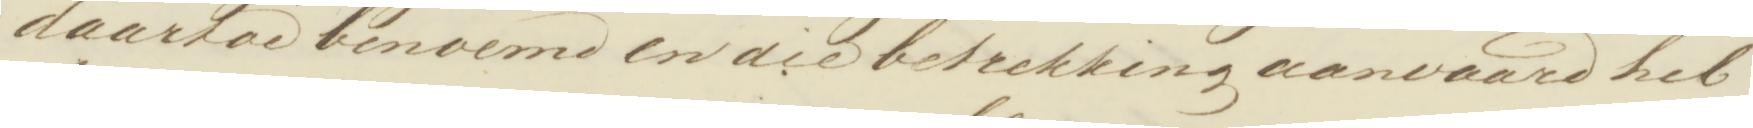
daartoe benoemd en die betrekking aanvaard heb
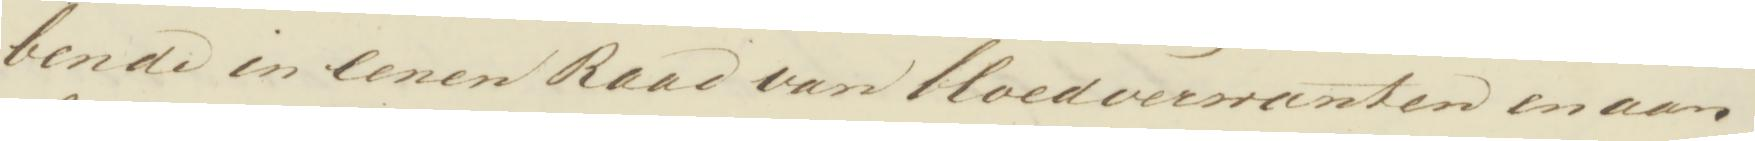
bende in eenen Raad van bloedverwanten en aan
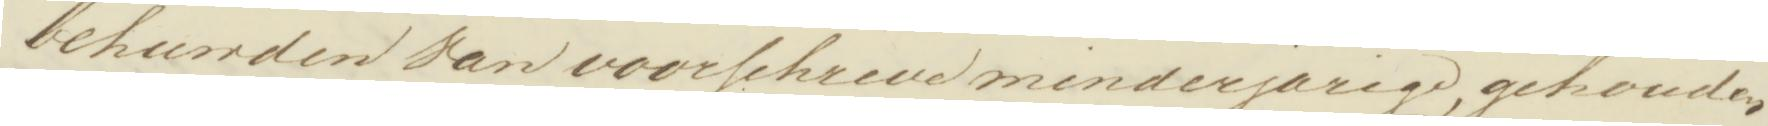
behuwden van voorschreve minderjarige, gehouden
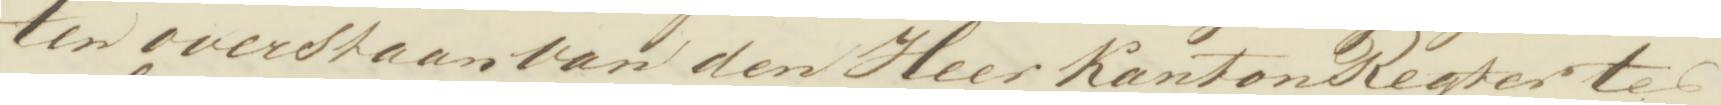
ten overstaan van den Heer Kanton Regter te
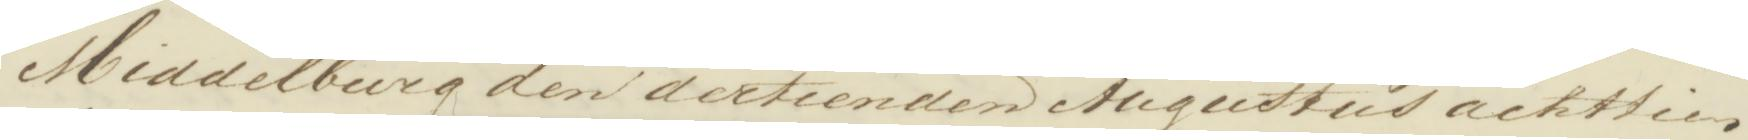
Middelburg den dertienden Augustus achttien
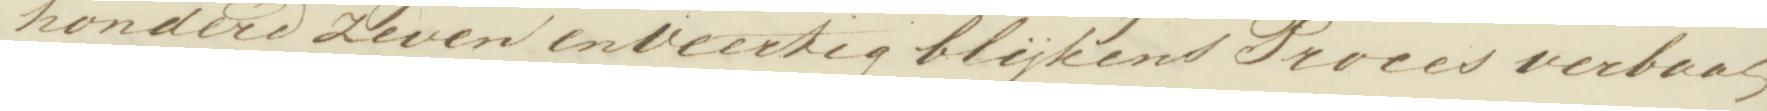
honderd zeven en veertig blijkens Proces verbaal
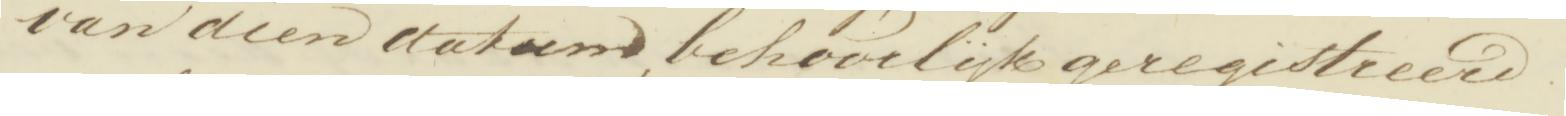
van dien datum, behoorlijk geregistreerd
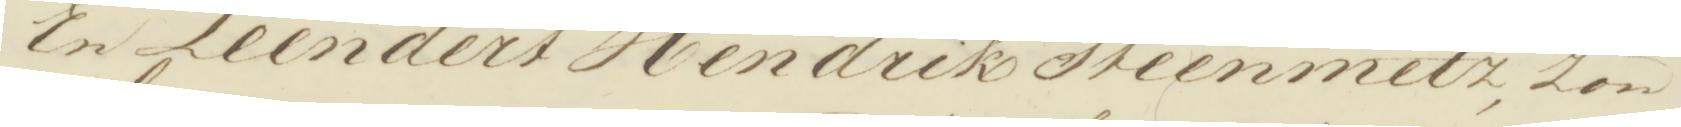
En Leendert Hendrik steenmetz, zon
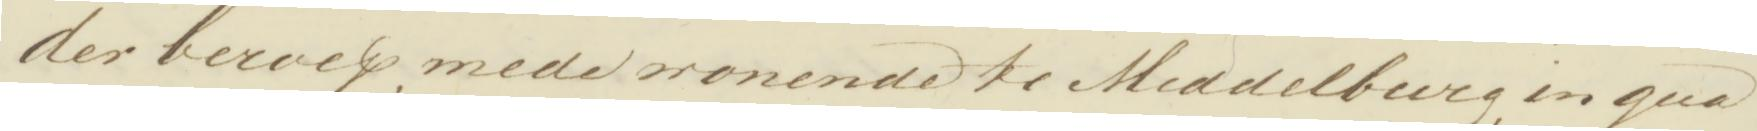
der beroep, mede wonende te Middelburg, in qua
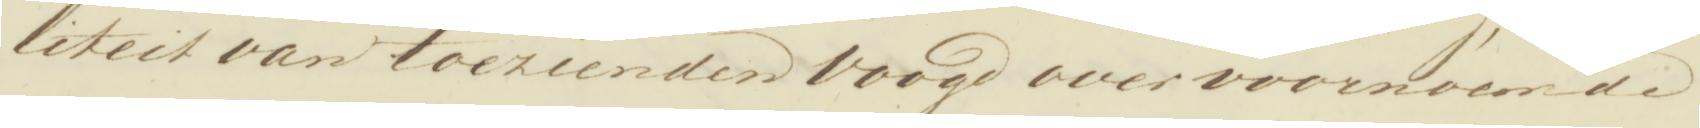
liteit van toezienden voogd over voornoemde
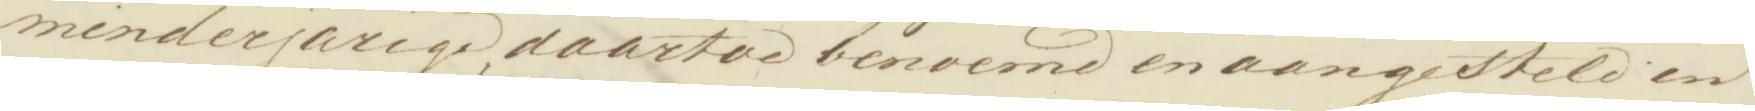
minderjarige, daartoe benoemd en aangesteld in
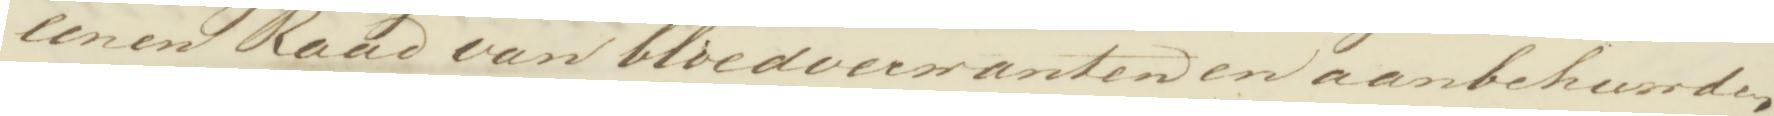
eenen Raad van bloedverwanten en aanbehuwden
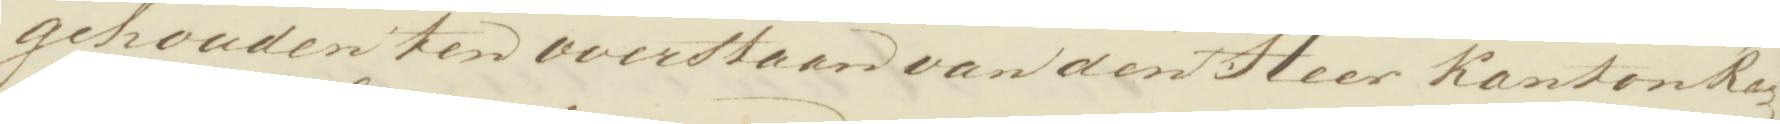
gehouden ten overstaan van den Heer KantonReg
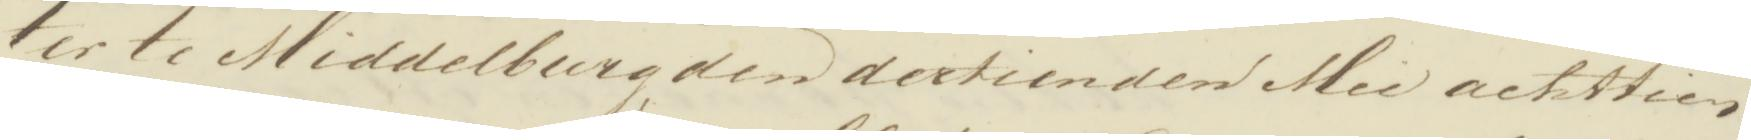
ter te Middelburg, den dertienden Mei achttien
